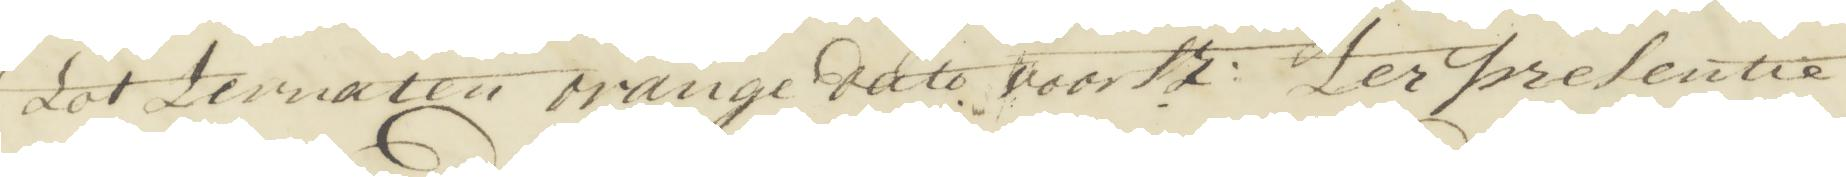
tot ternaten orange dato voorsz: ter presentie
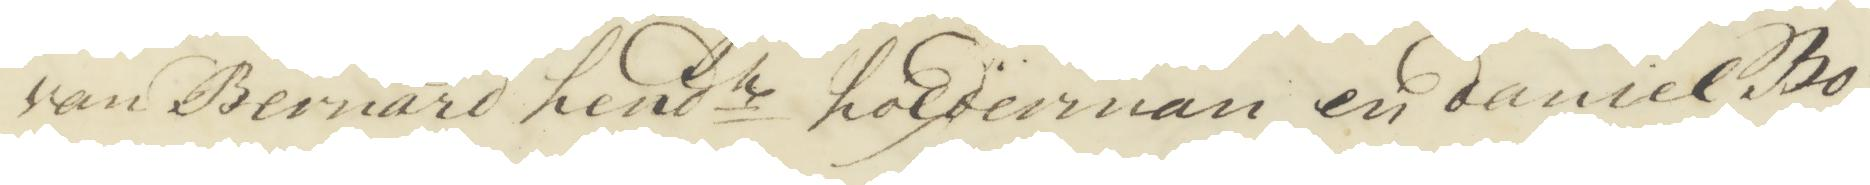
van Bernard hend=k kolderman en daniel Bo
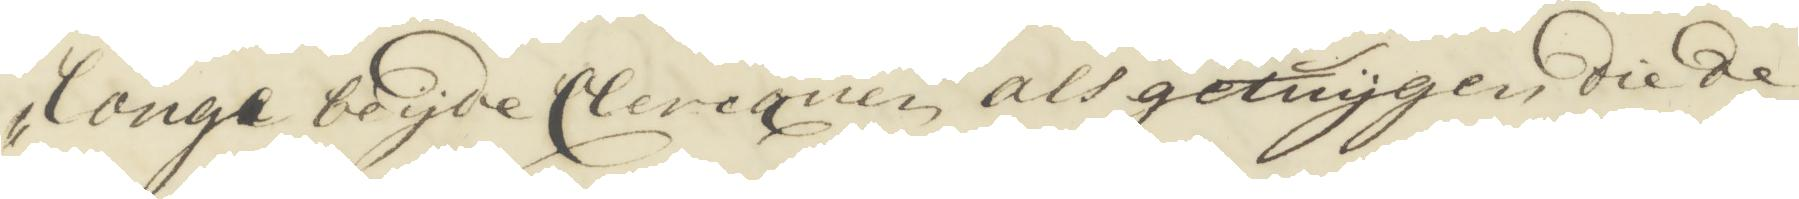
„longe beijde Clercquen als getuijgen die de
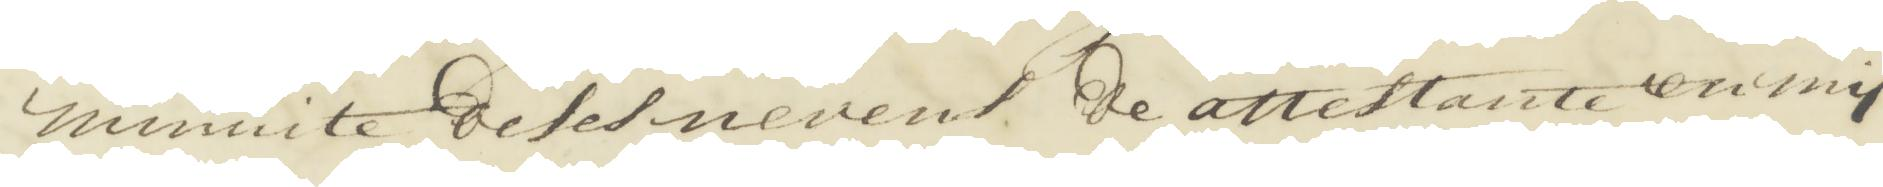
minuite deses nevens de attestante en mij
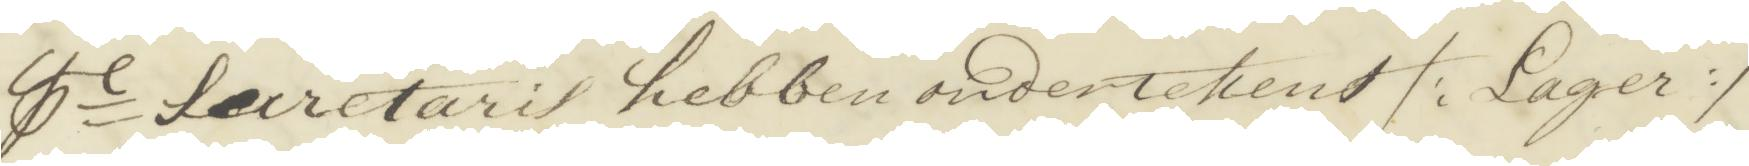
p=l secretaris hebben ondertekent /: Lager :/
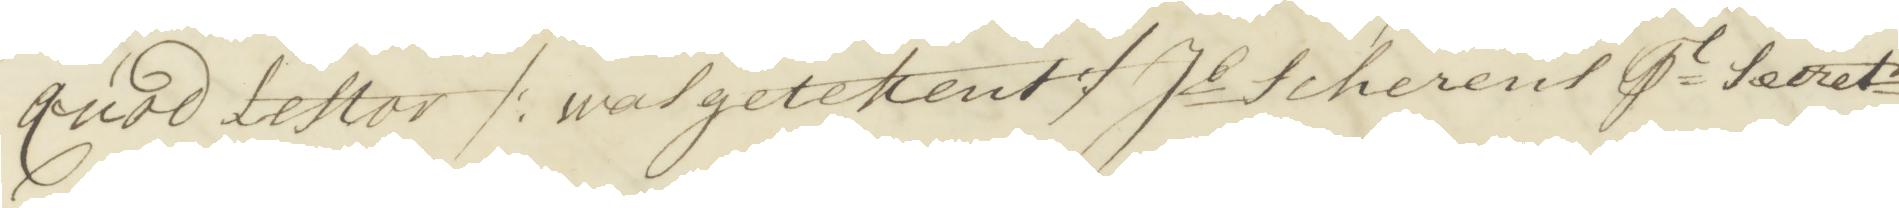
quod testor /: was getekent :/ J=b scherens p=l Secretr
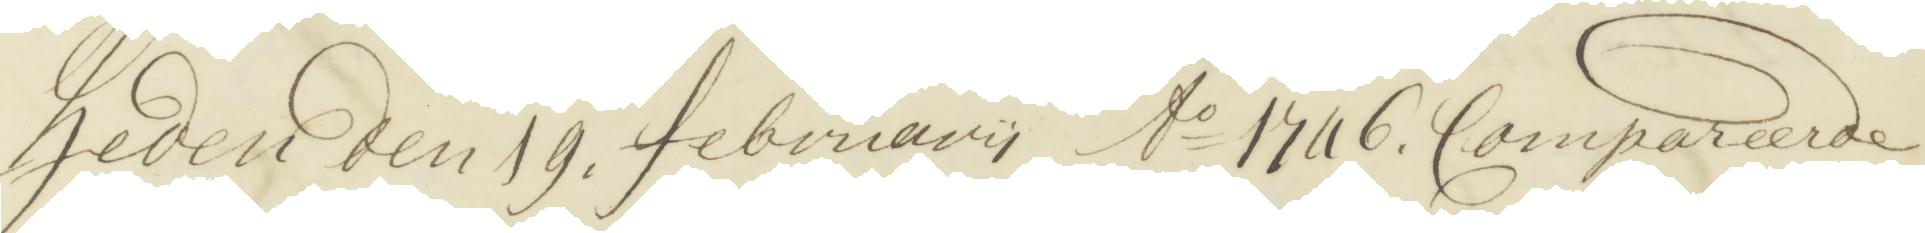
Heden den 19. februarij A=o 1746. Compareerde
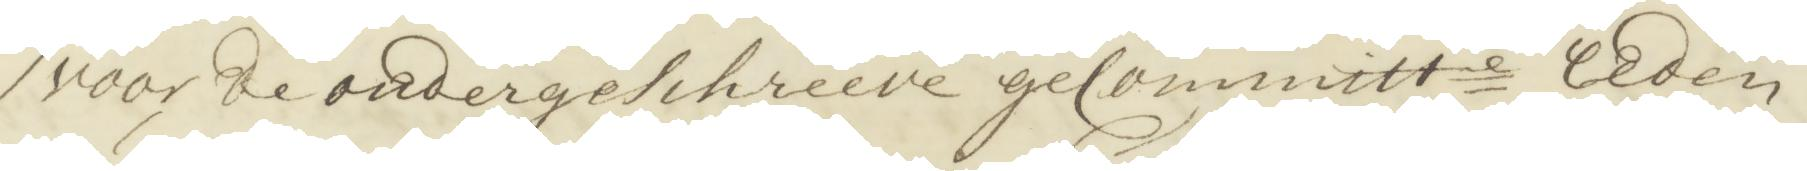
voor de ondergeschreeve gecommitt=e leden
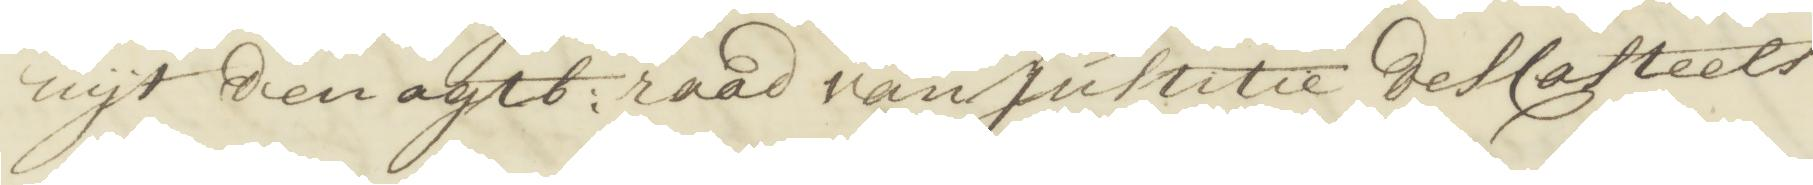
uijt den agtb: raad van Justitie des Casteels
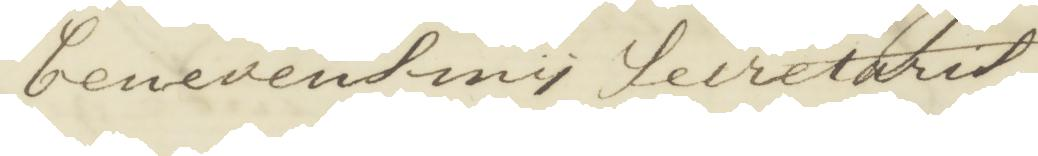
benevens mij Secretaris
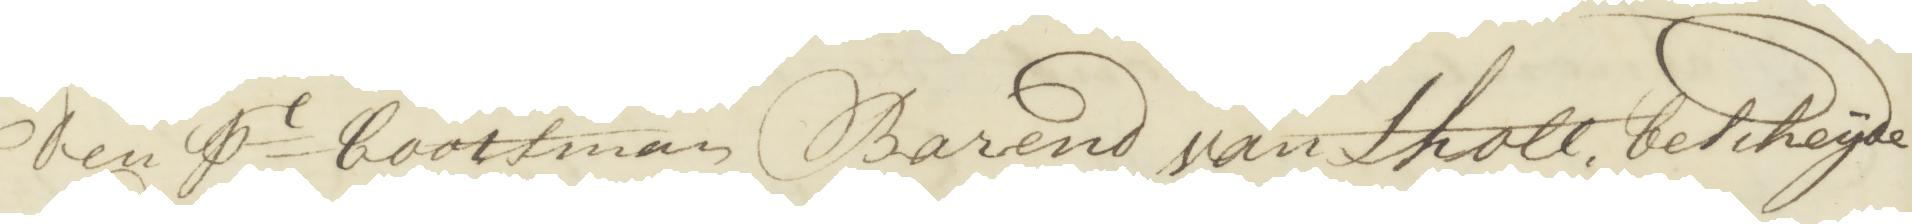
den p=l bootsman Barend van Tholl, bescheijde
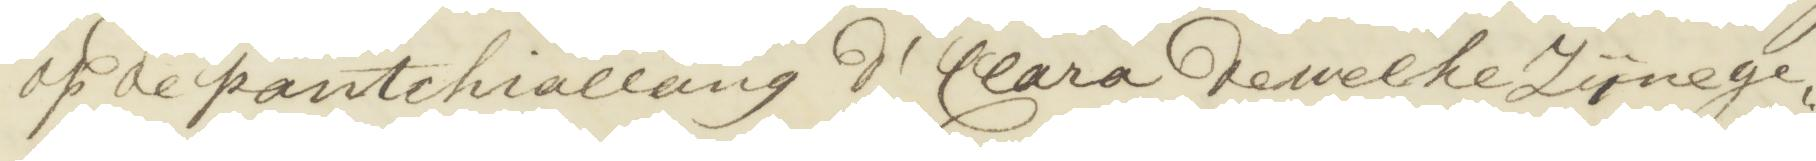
op de pantchiallang d’Clara dewelke zijne ge
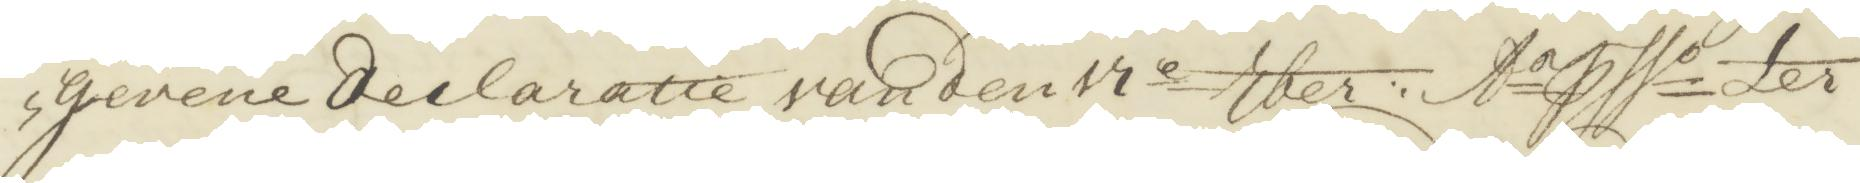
„gevene declaratie van den 17=e 7ber: A=o pss=o ter
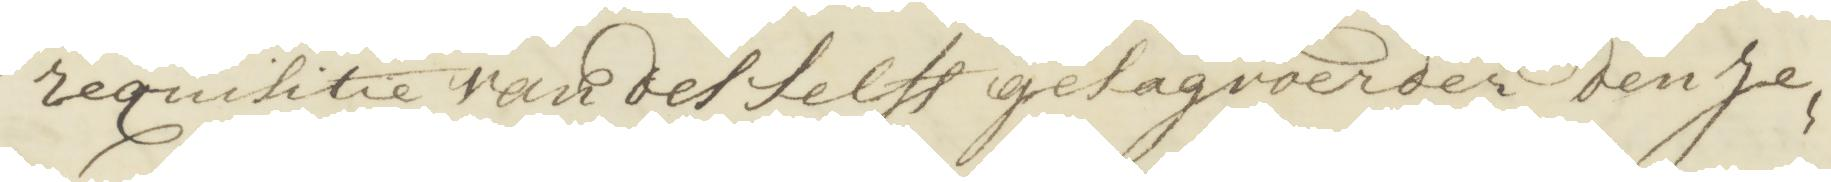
requisitie van desselfs gesagvoerder den Je„
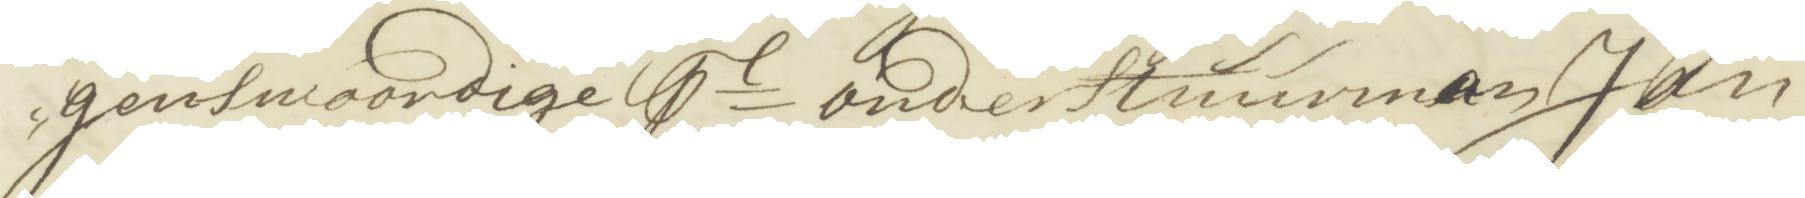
„genswoordige p=l onderstuurman Jan
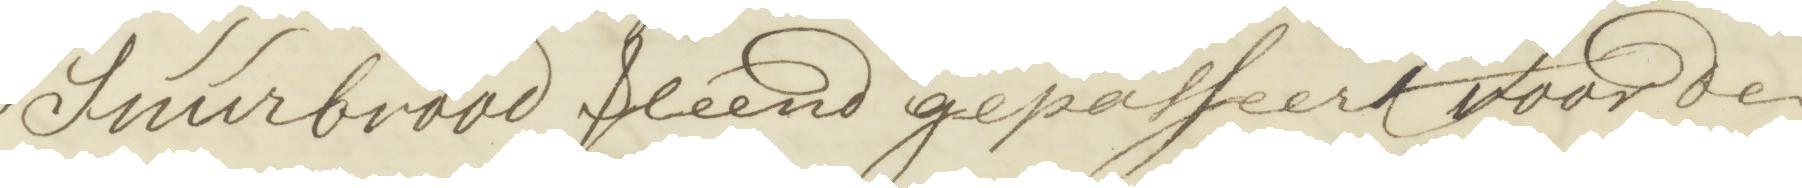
Suurbrood verleend gepasseert voor den
